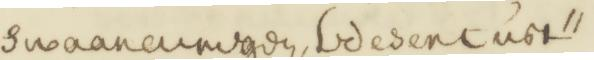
swaaren regen, tedeser cust
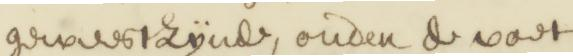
geweest zijnde, onder de voet
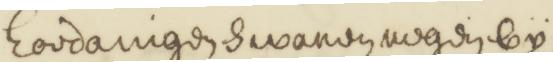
hoedanigen swaren regen bij
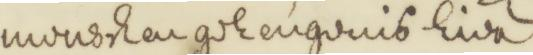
menschen geheugenis hier
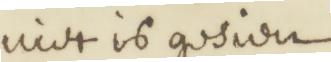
niet is gesien
